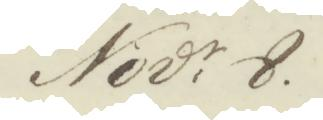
Nov:r 8.
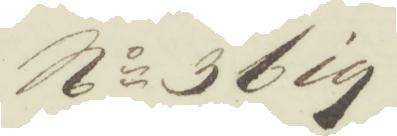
N=o 3619
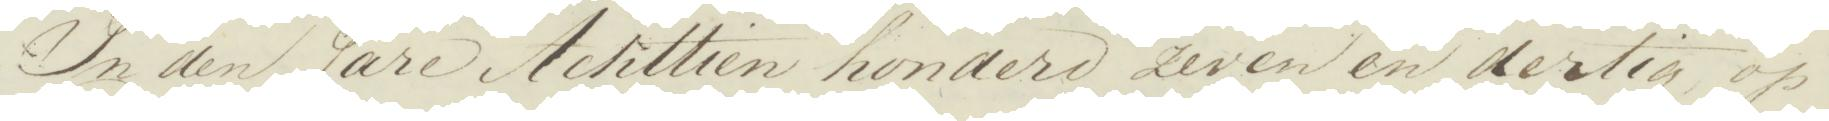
In den Jare Achttien honderd zeven en dertig, op
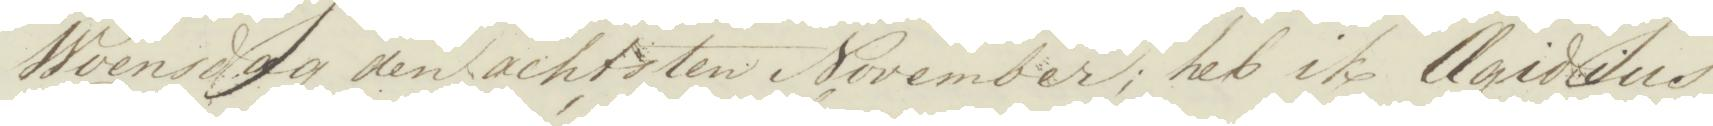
Woensdag den achtsten November; heb ik AEgidius
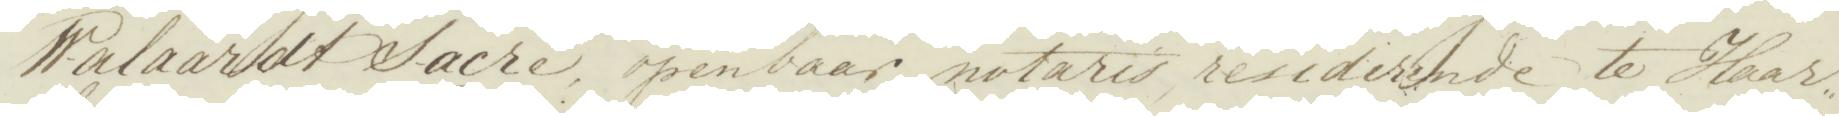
Walaardt Sacré, openbaar notaris, residerende te Haar
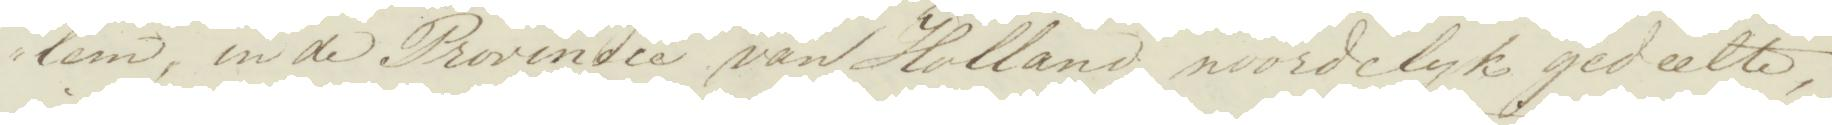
„lem, in de Provincie van Holland noordelyk gedeelte,
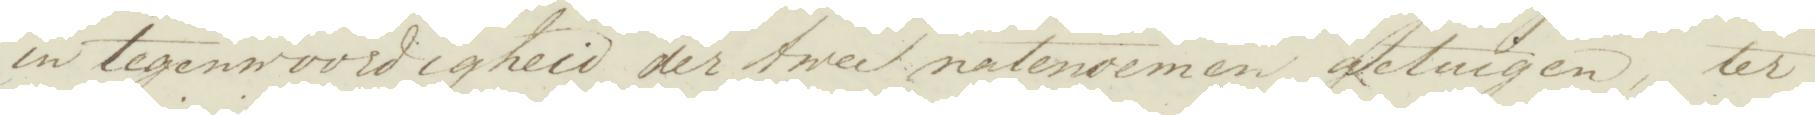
in tegenwoordigheid der twee natenoemen getuigen, ter
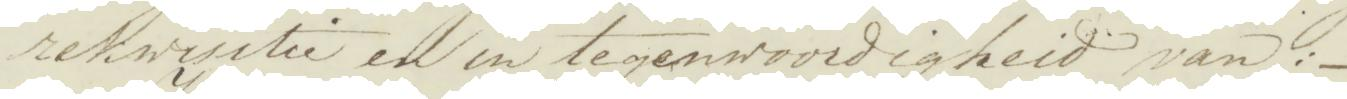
rekwisitie en in tegenwoordigheid van:
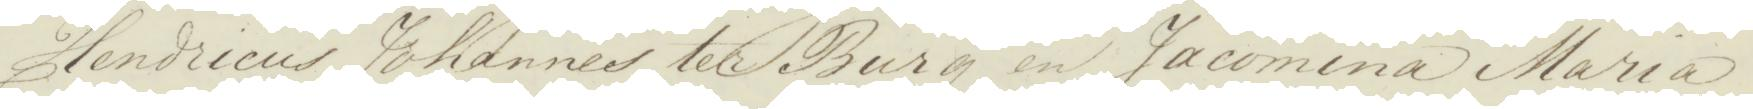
Hendricus Johannes ter Burg en Jacomina Maria
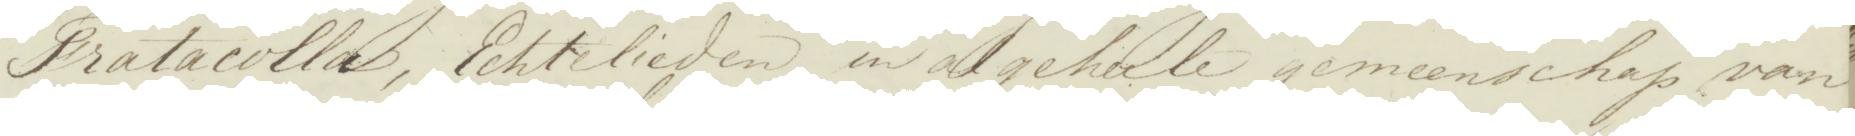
Fratacolla, Echtelieden in algehele gemeenschap van
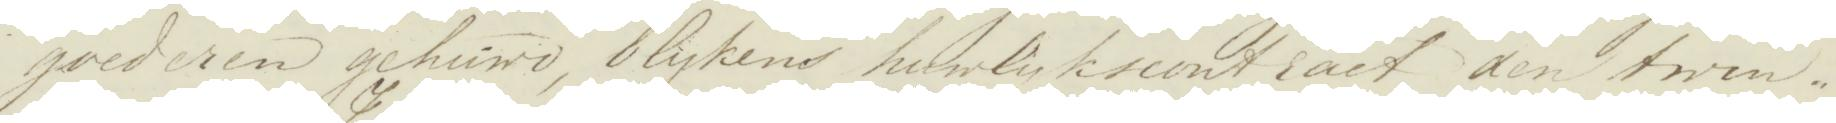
goederen gehuwd, blykens huwlykscontract den twin„
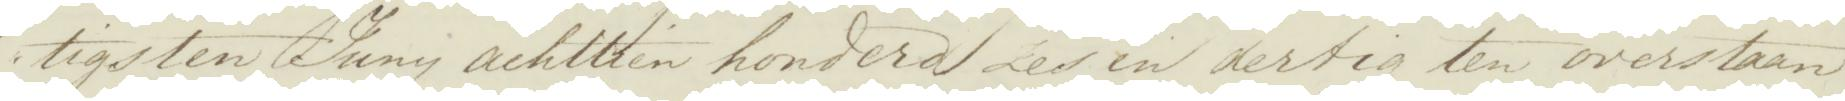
„tigsten Iuny achttien honderd zes en dertig ten overstaan
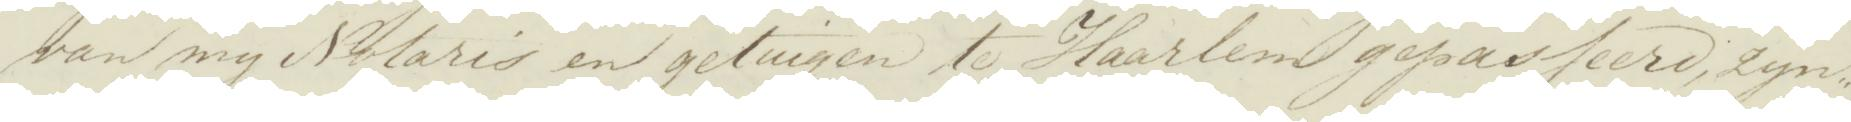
van my Notaris en getuigen, te Haarlem gepasseerd, zyn„
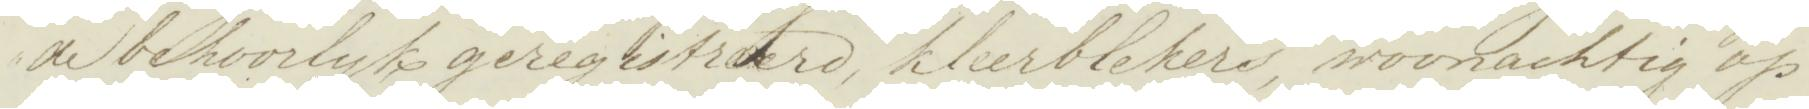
„de behoorlyk geregistreerd, kleerblekers, woonachtig op
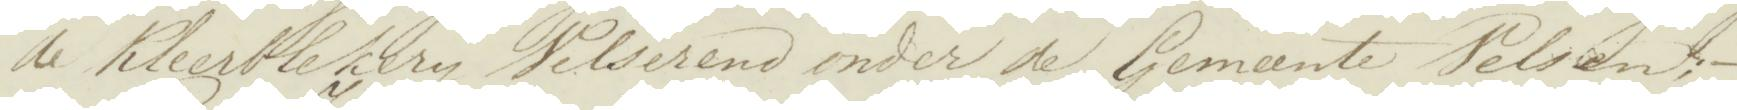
de Kleerblekery Velserend onder de Gemeente Velsen;
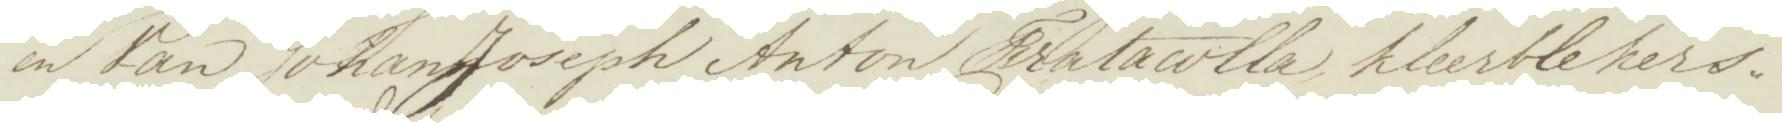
en van Johan Joseph Anton Fratacolla, kleerblekers„
